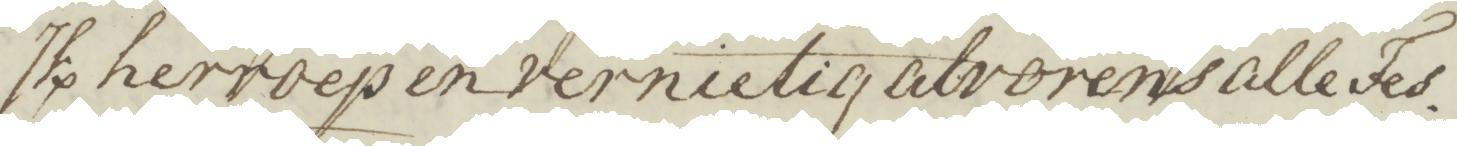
Ik herroep en vernietig alvorens alle Tes„
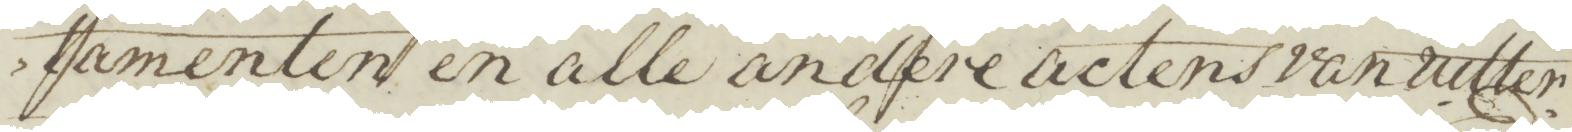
„tamenten en alle andere actens van uitter„
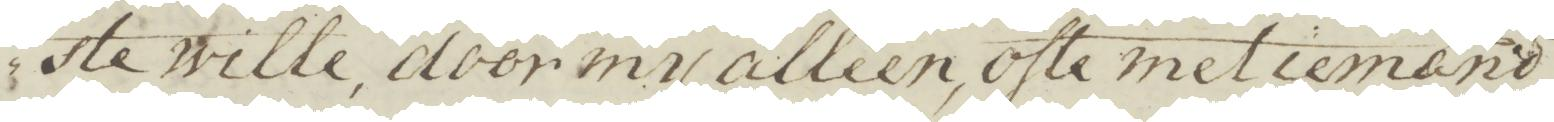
„ste wille, door my alleen, ofte met iemand
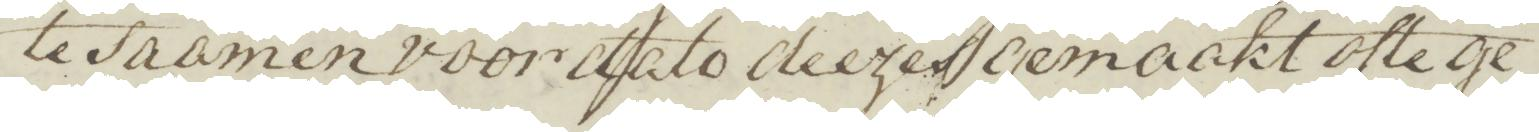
te saamen voor dato deezes gemaakt ofte ge
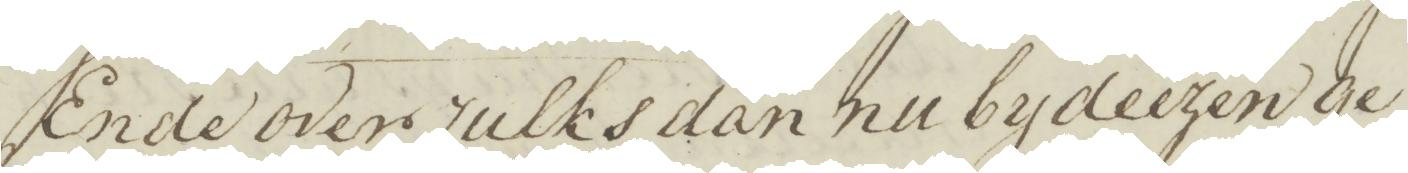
Ende over zulks dan nu by deezen ge
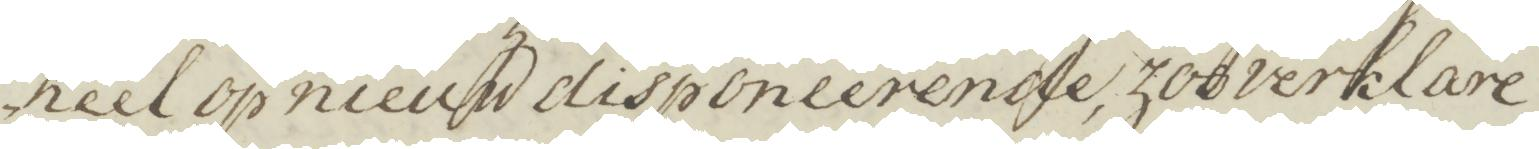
„heel op nieuw disponeerende, zoo verklare
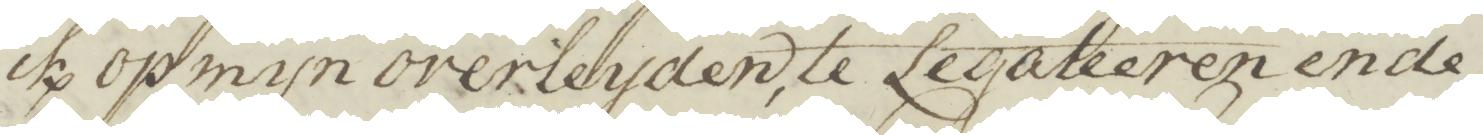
ik op myn overleyden te Legateeren ende
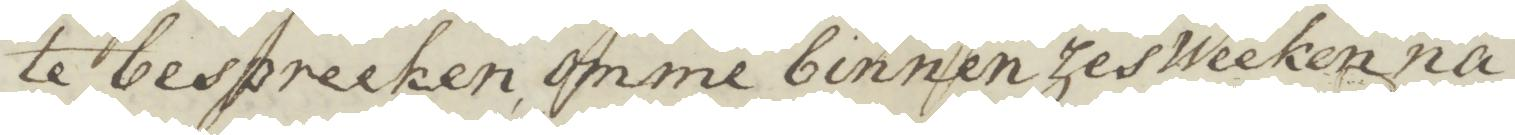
te bespreeken, omme binnen zes weeken na
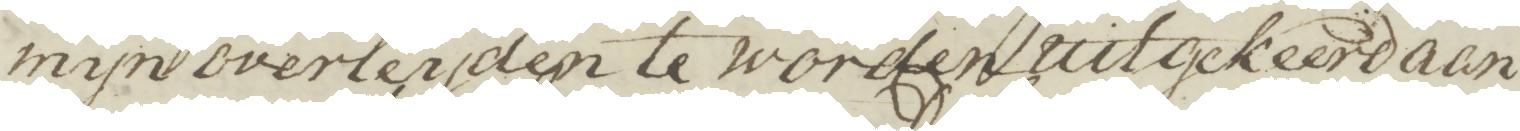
myn overleyden te worden uitgekeerd aan
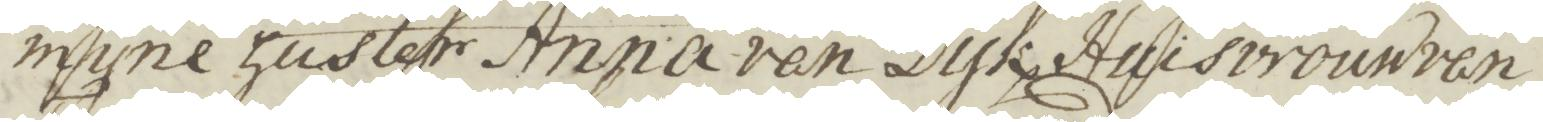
myne zuster Anna van Dyk Huisvrouw van
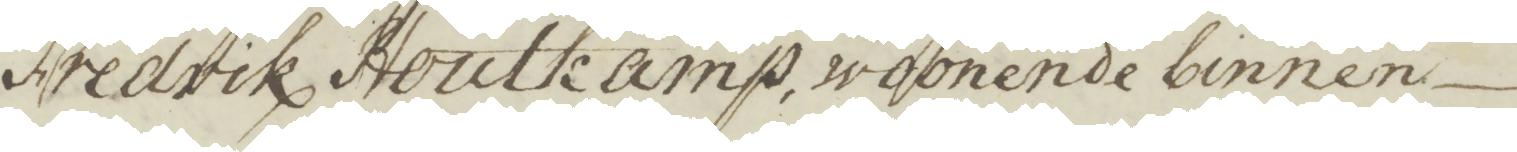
Fredrik Houtkamp, woonende binnen—
